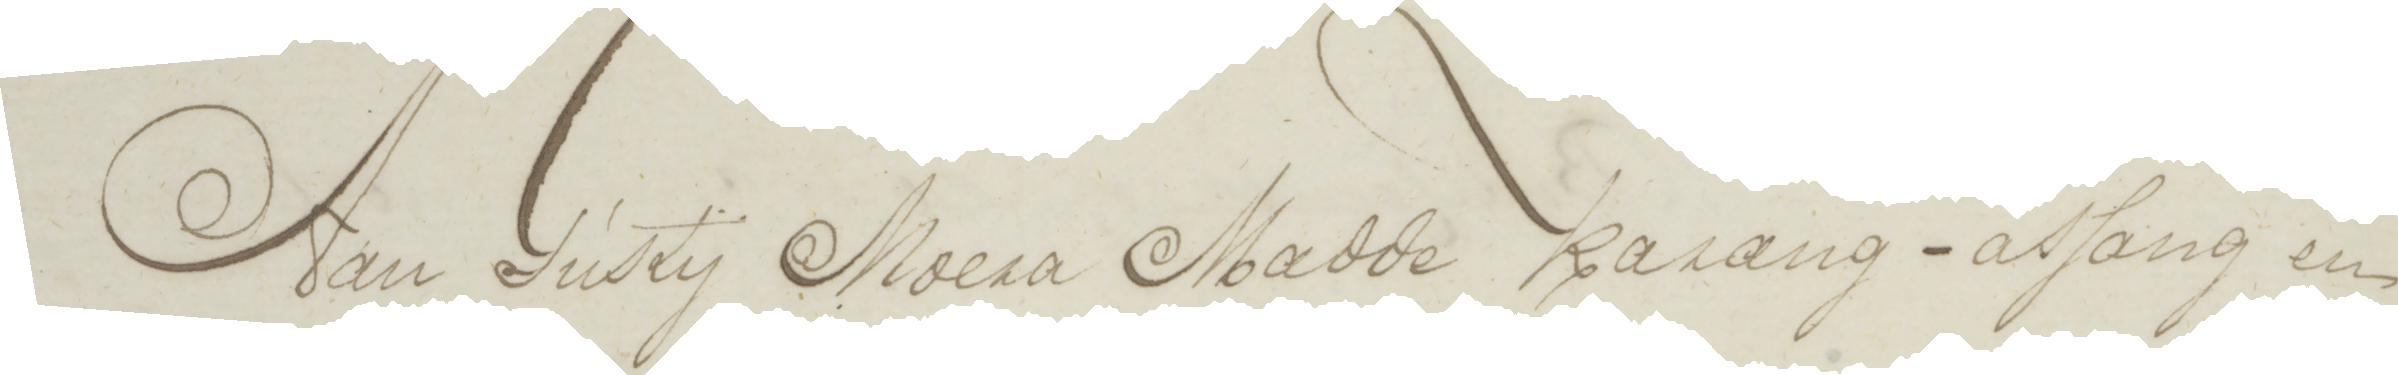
Aan Gustij Moera Mabbe Karang - assang en
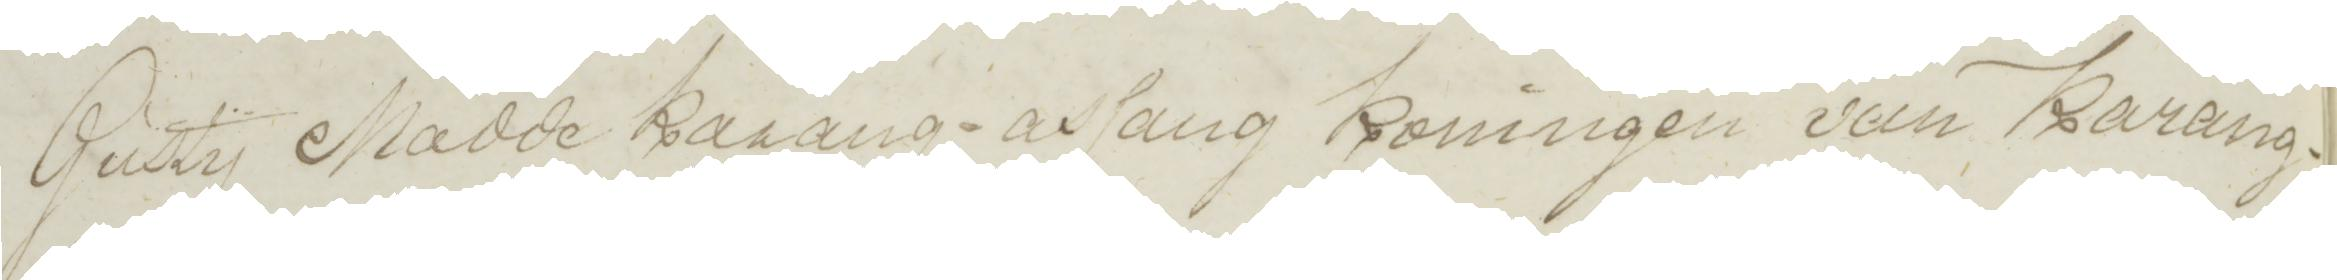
Gustij Madde karang-assang Koningen van Karang
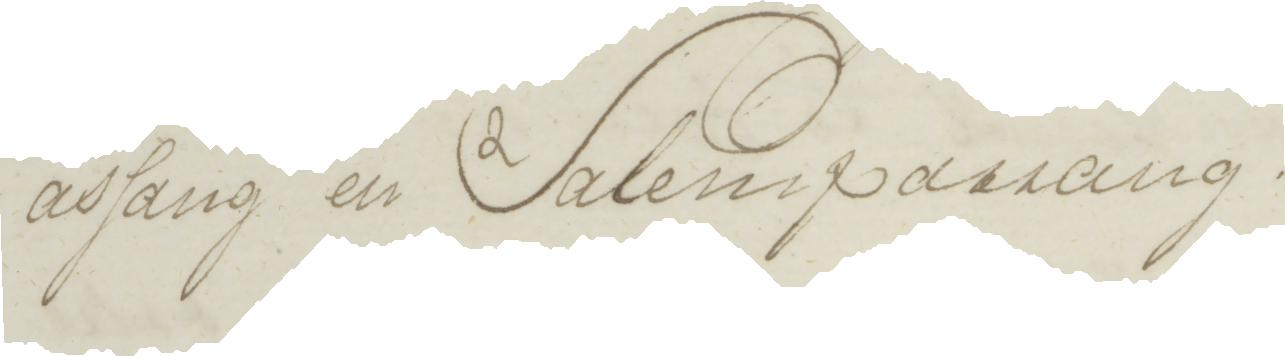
assang en Salemparrang
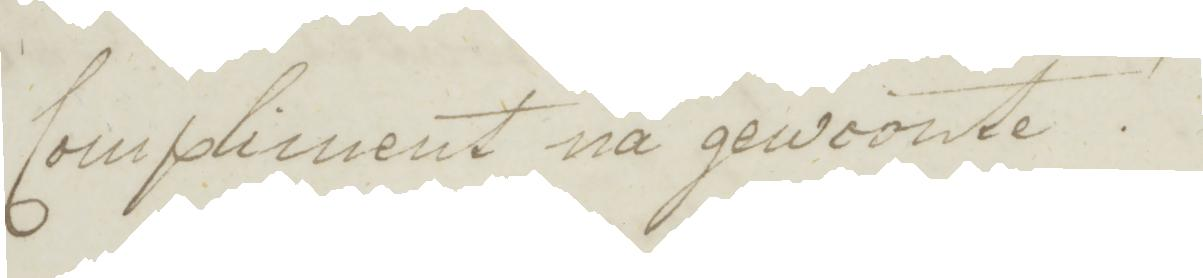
Compliment na gewoonte!
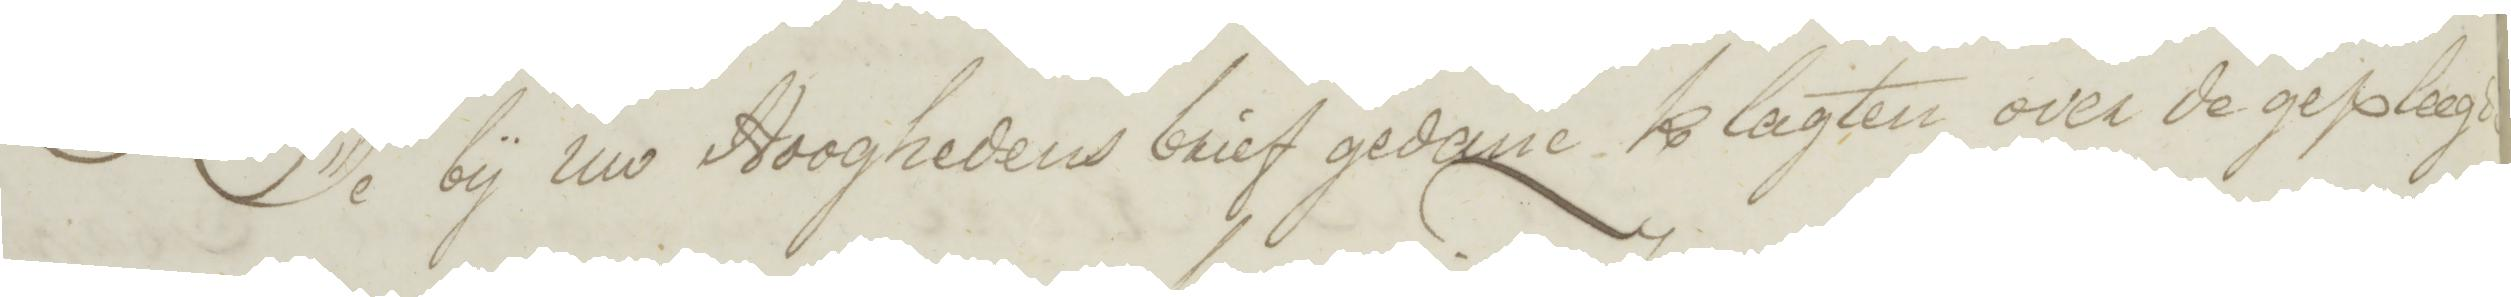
De bij uw Hooghedens brief gedane klagten over de gepleegd
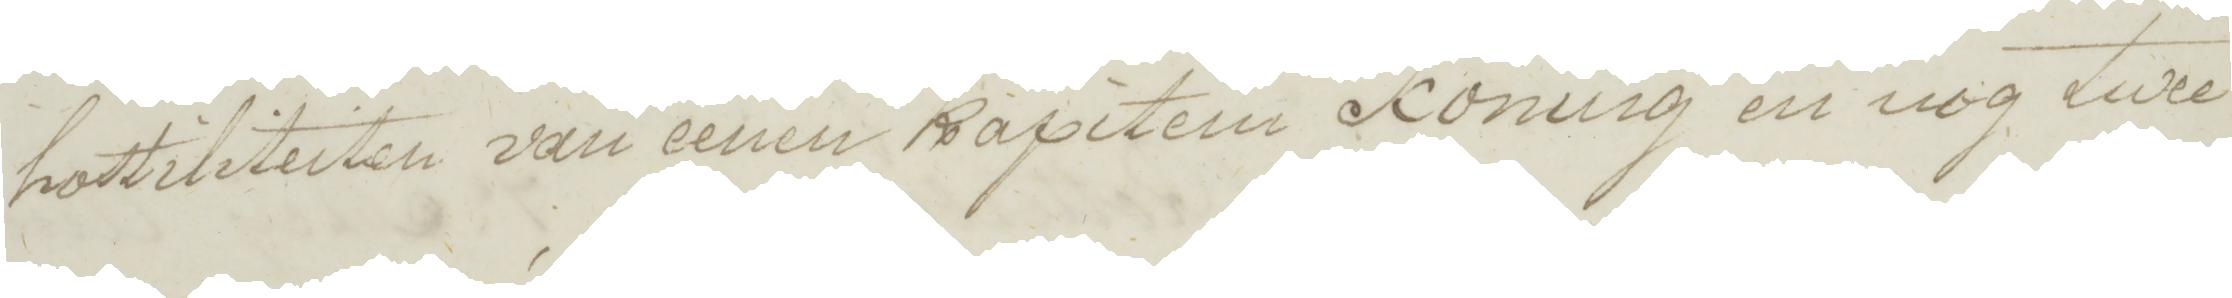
hostiliteiten van eenen kapitein Koning en nog twee
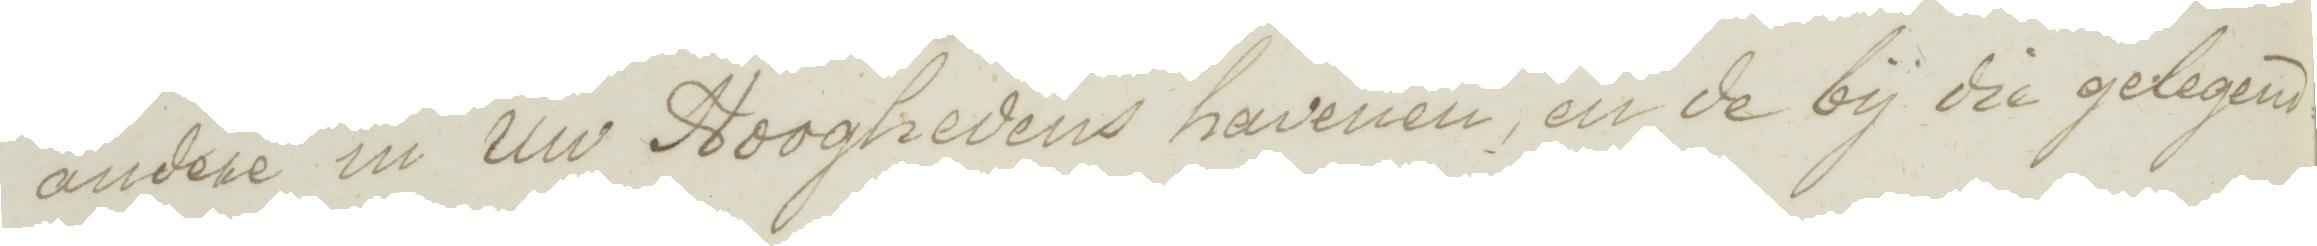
andere in Uw Hooghedens havenen, en de bij die gelegend
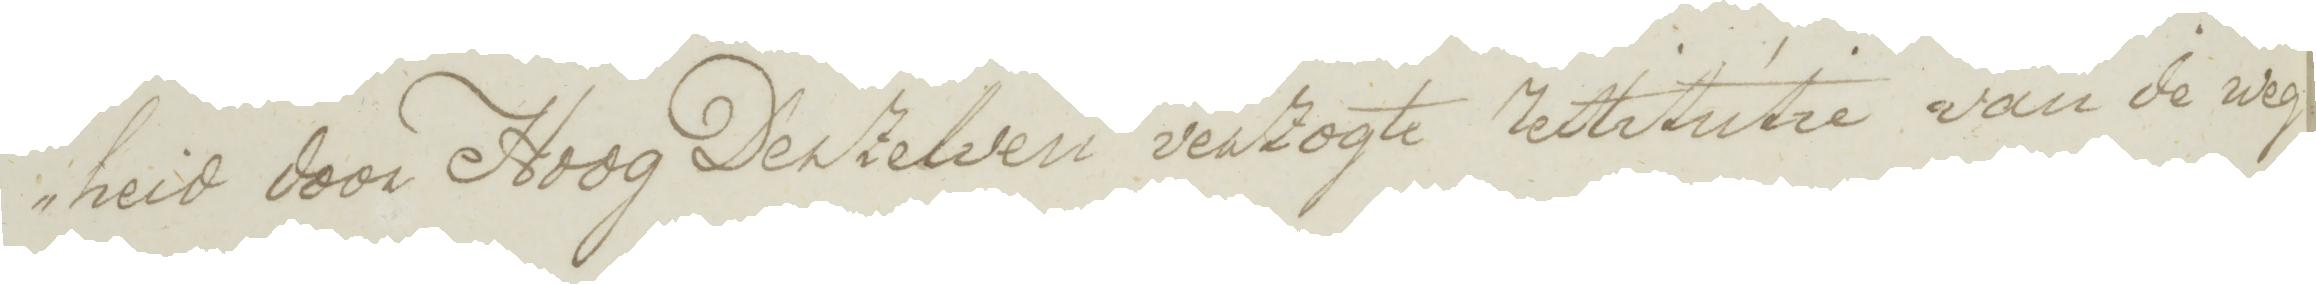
„heid door Hoog Derzelven verzogte restitutie van de weg
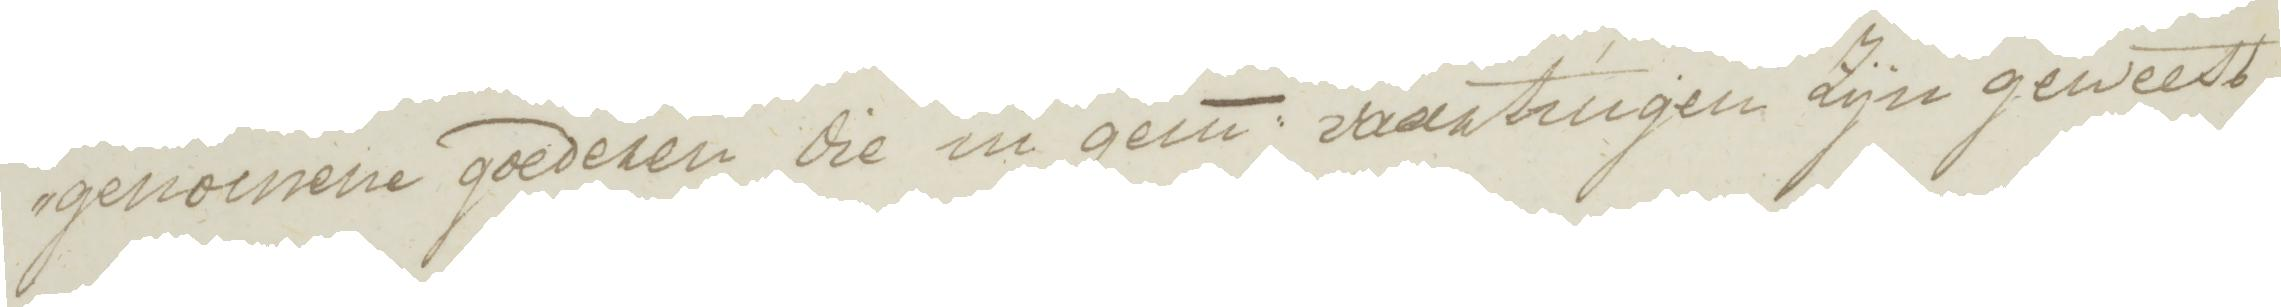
„genoemene goederen die in gem: vaartuigen zijn geweest,
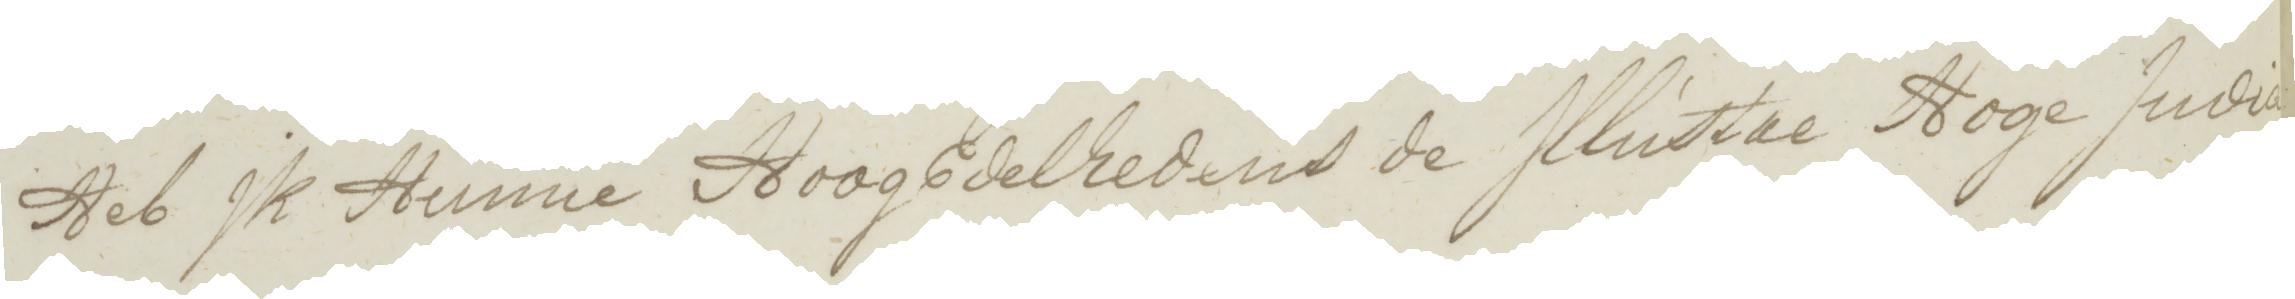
Heb jk Hunne HoogEdelhedens de Jllustre Hoge Jndia
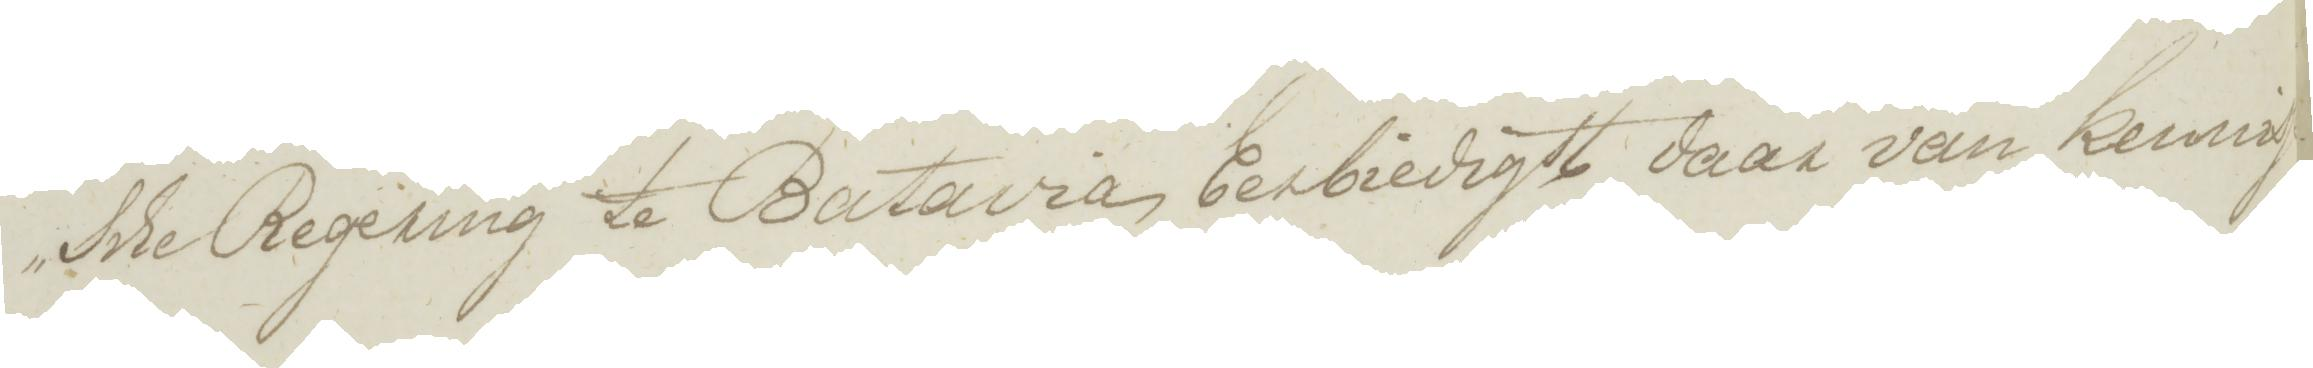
„sche Regering te Batavia Eerbiedigst daar van kennis
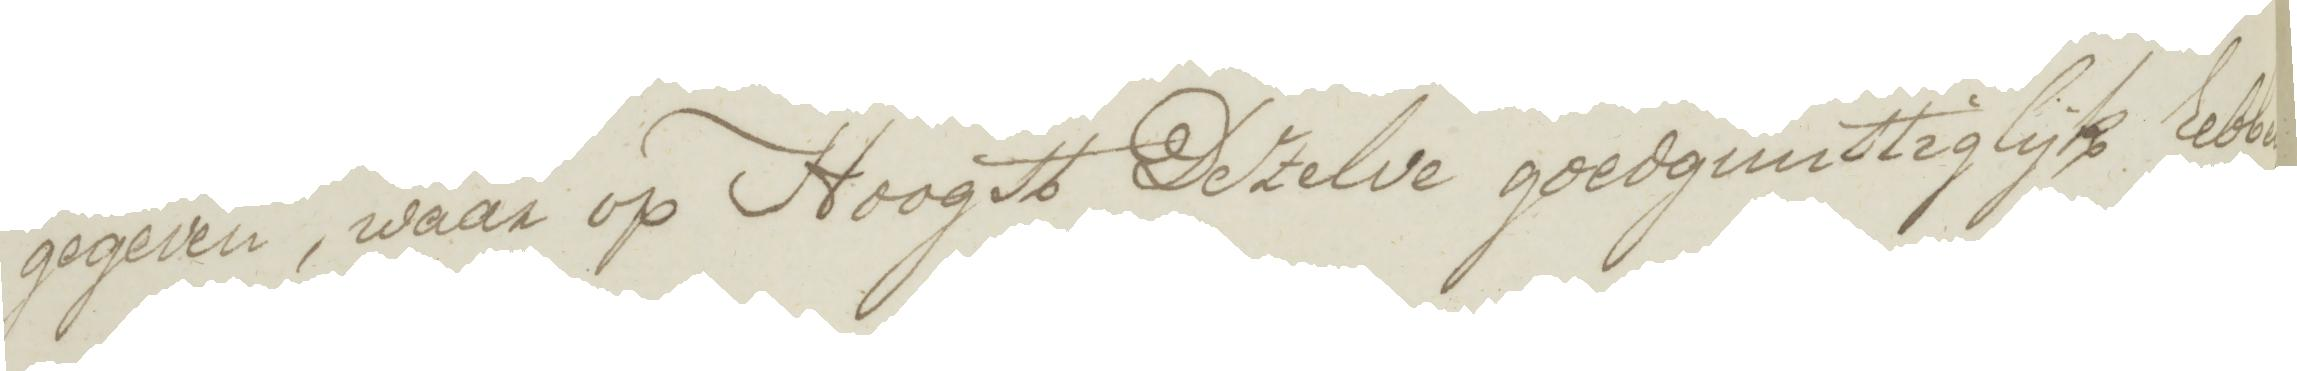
gegeven, waar op Hoogst Dezelve goedgunstiglijk hebbe
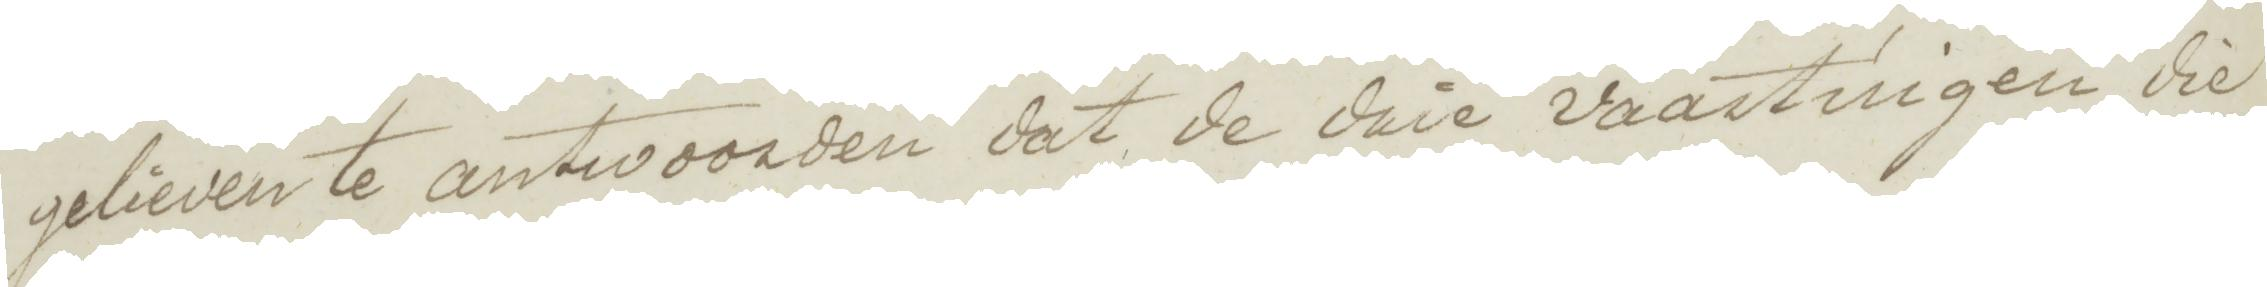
gelieven te antwoorden dat de drie vaartuigen die
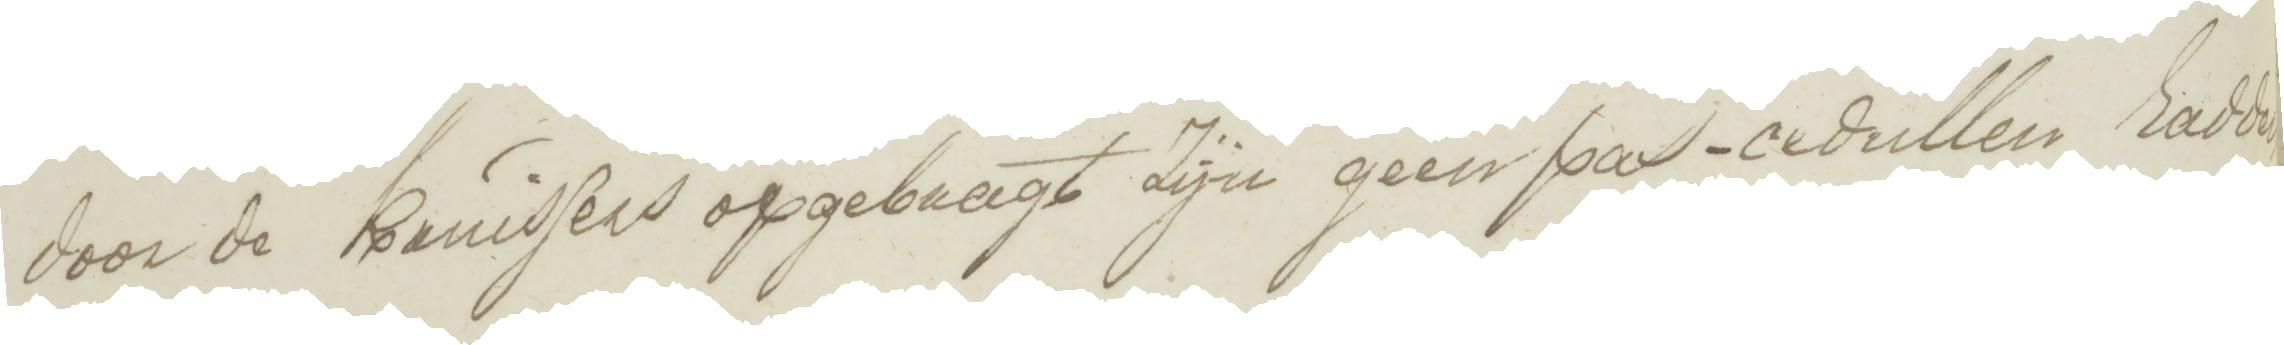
door de kruissers opgebragt zijn geen pas-cedullen hadde
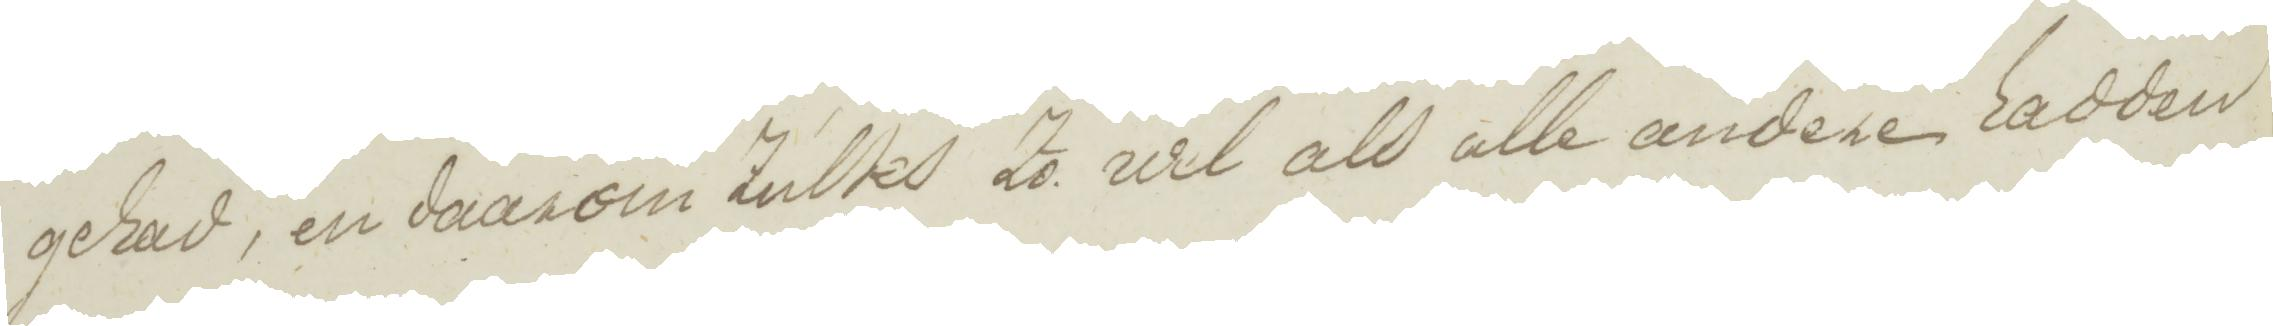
gehad, en daarom zulks zo wel als alle andere hadden
